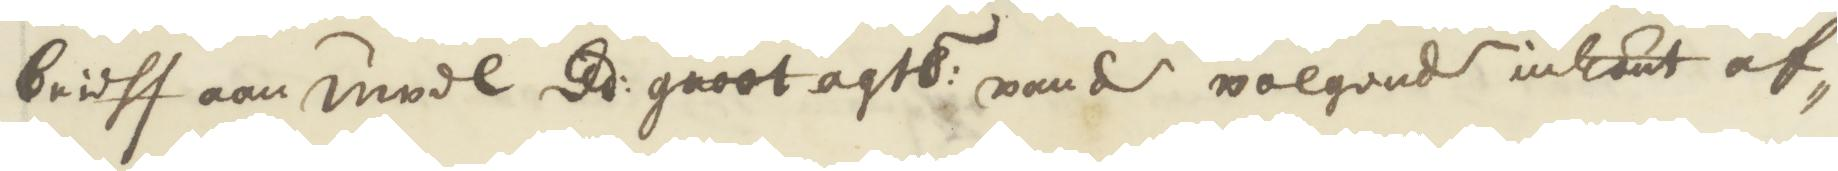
brieff aan uwel Ed: groot agtb: van de volgende inhout af
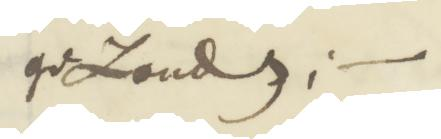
gezonden; —
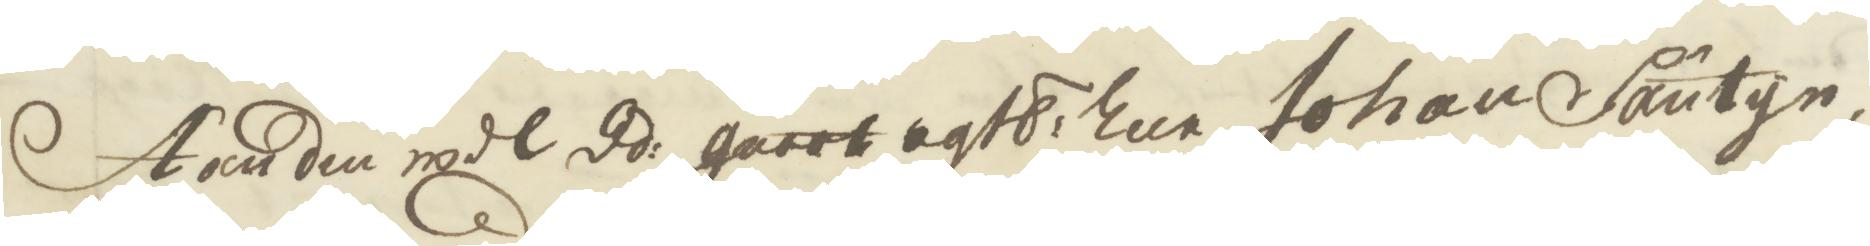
Aan den wel Ed: groot agtb: heer Johan sautijn,
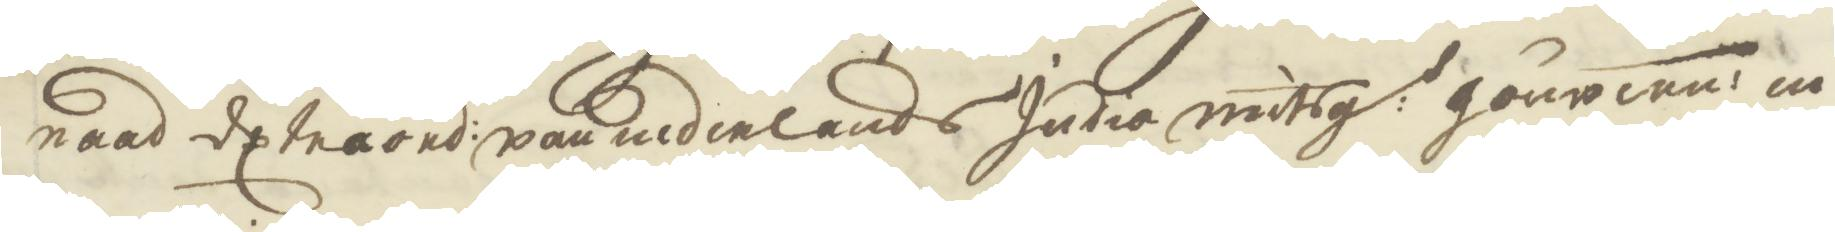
raad extraord: van nederlands jndia mitsg:s gouvern: en
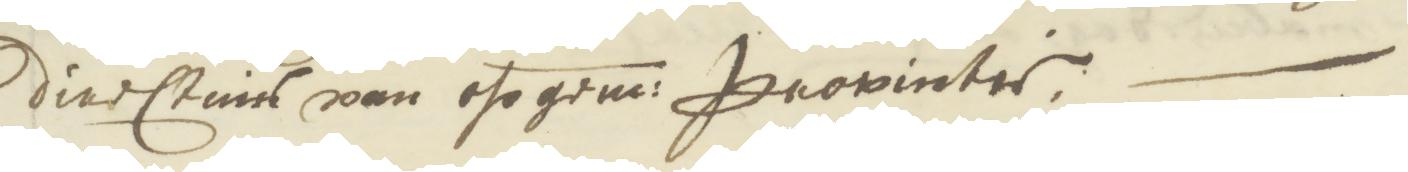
directeur van op gem: provintie. —
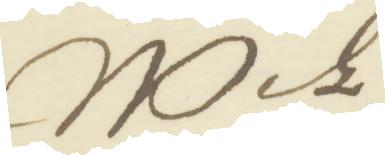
Wel
